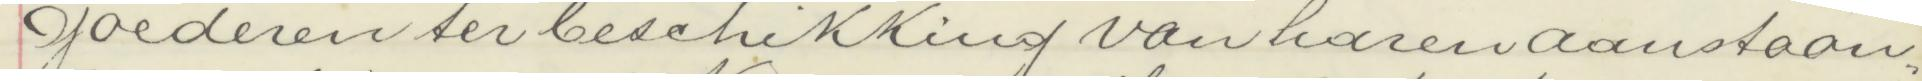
goederen ter beschikking van haren aanstaan„
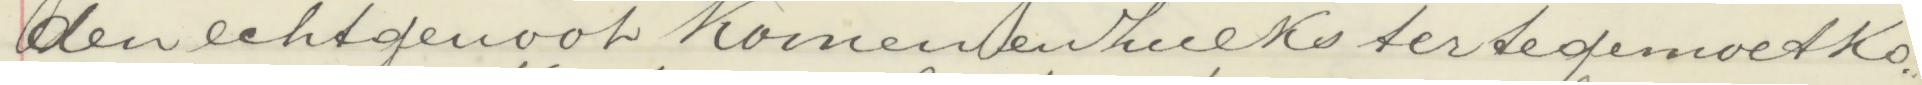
den echtgenoot komen en zulks ter tegemoetko„
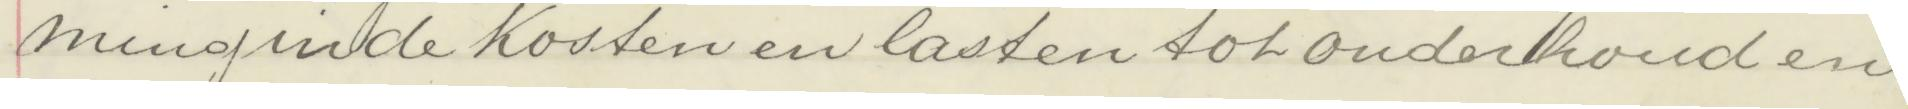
ming in de kosten en lasten tot onderhoud en
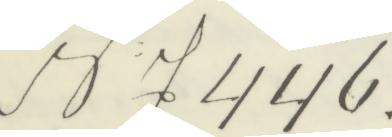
No 7446.
